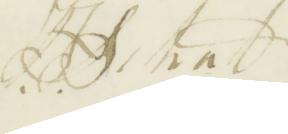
J.J. Schat
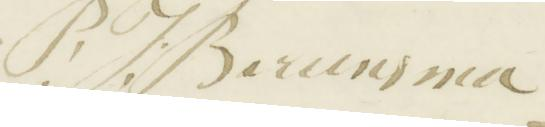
P:J: Bruinsma
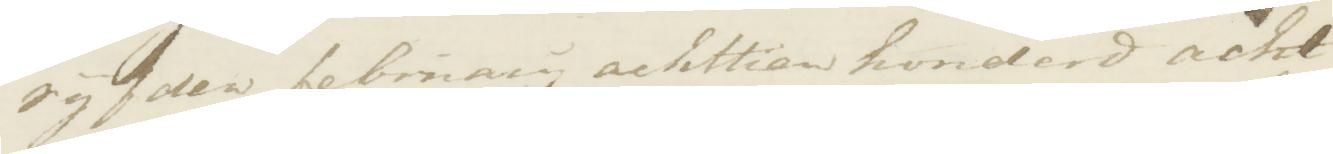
vijfden februarij achttien honderd acht
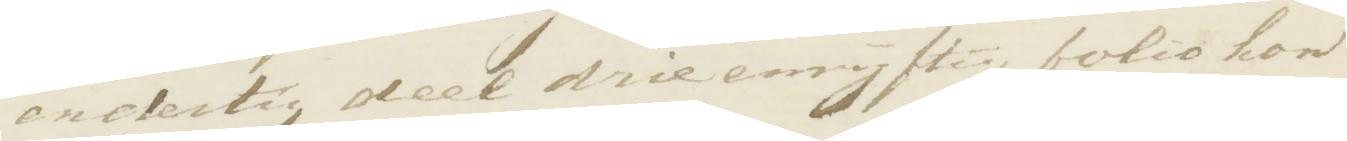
en dertig deel drie envijftig folio hon
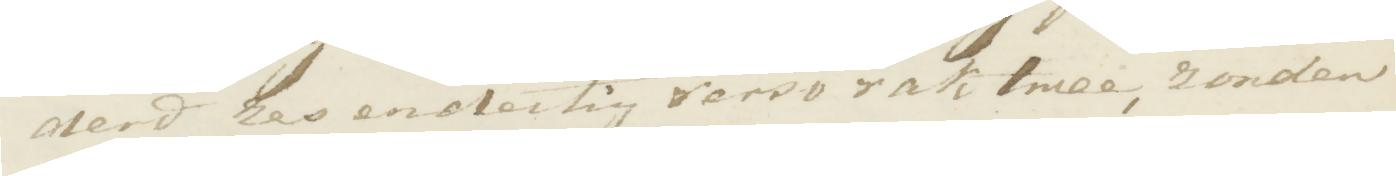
derd zes en dertig verso vak twee, zonder
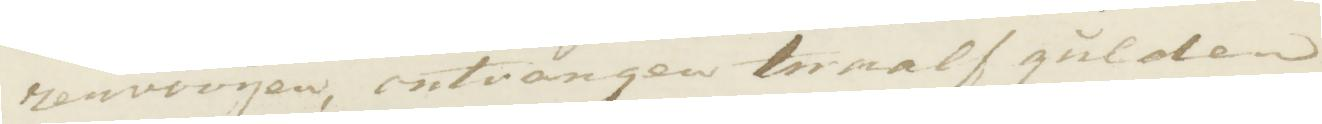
renvooijen, ontvangen twaalf gulden
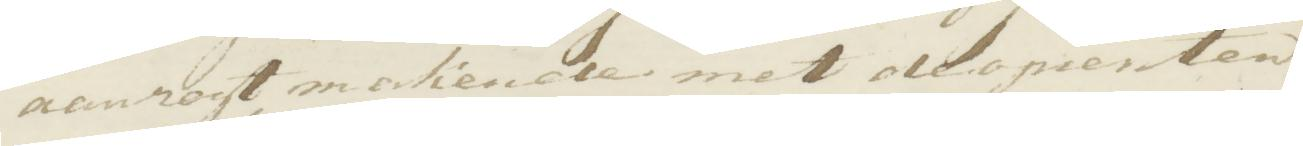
aan regt, makende met de opcenten
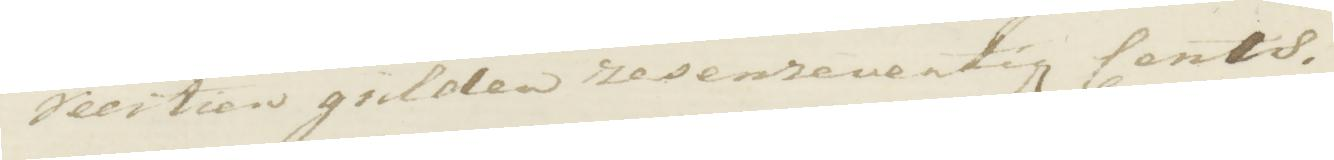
veertien gulden zes enzeventig Cents,
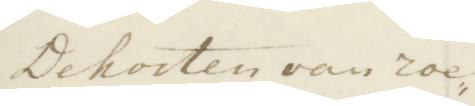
De kosten van roe
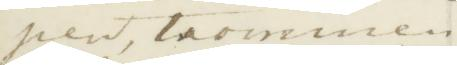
pen, trouwen
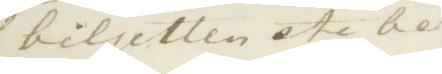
biljetten etc be
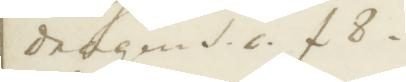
dragen s. c. ƒ8
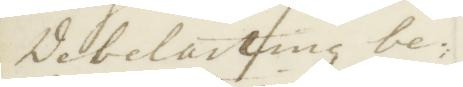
De belasting be„
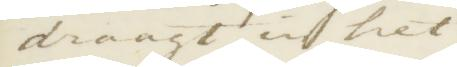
draagt in het
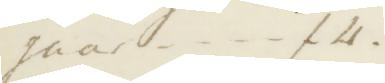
Jaar - - - - ƒ4
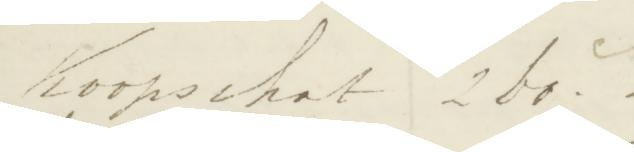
Koopschat 260.
